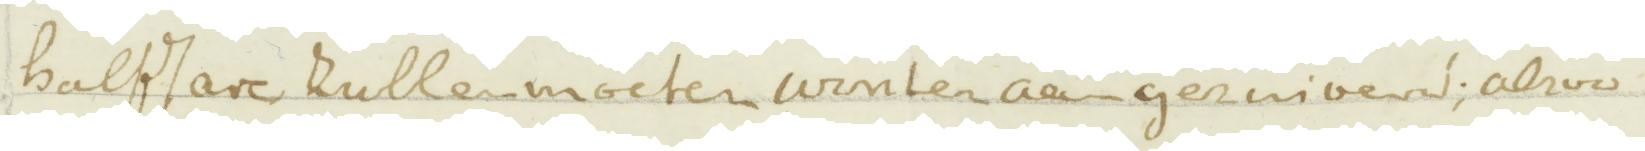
half Jare zullen moeten worden aangezuiverd; alzoo
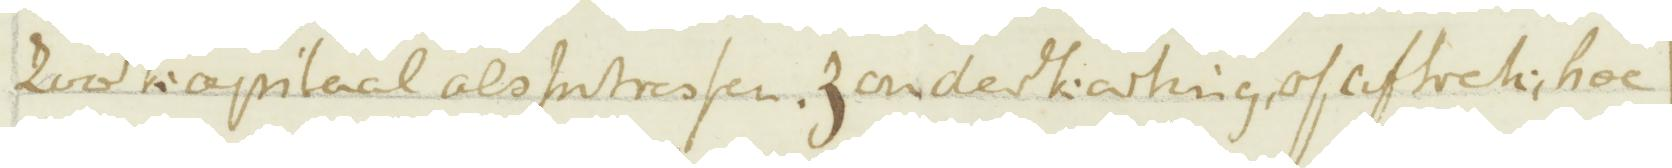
zoo kapitaal als Jntressen, Zonder korting, of aftrek; hoe
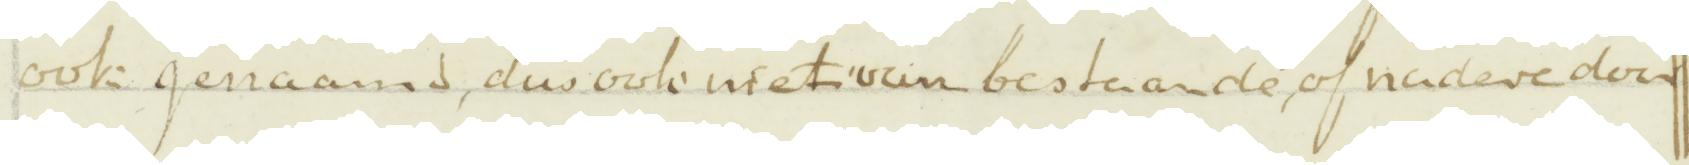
ook genaamd, dus ook niet van bestaande, of nadere door
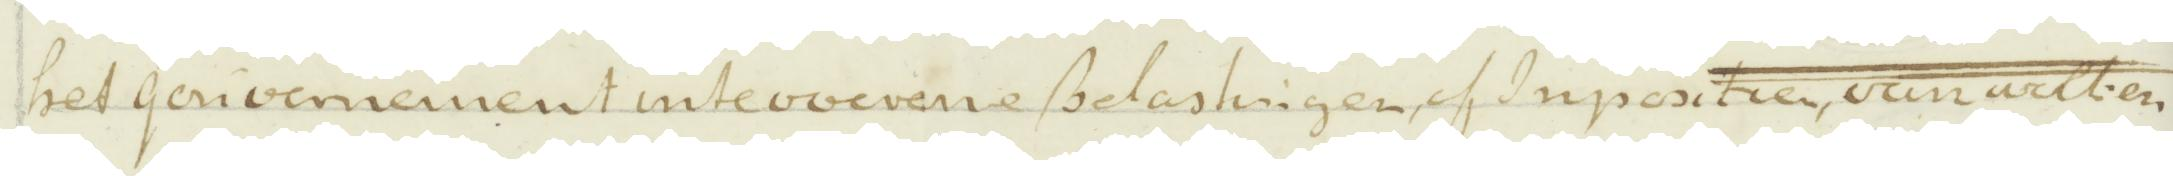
het gouvernement in te voerene Belastingen, of Inpositien, van welken
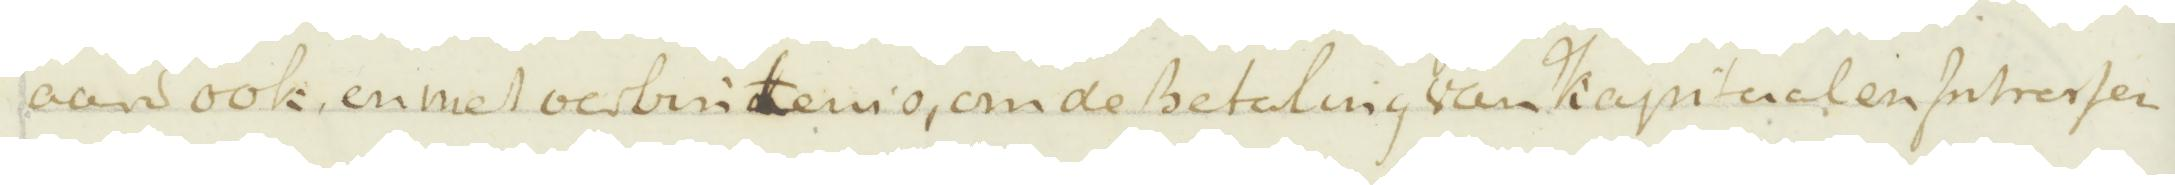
aard ook, en met verbintenis, om de Betaling van Kapitaal en Jntressen
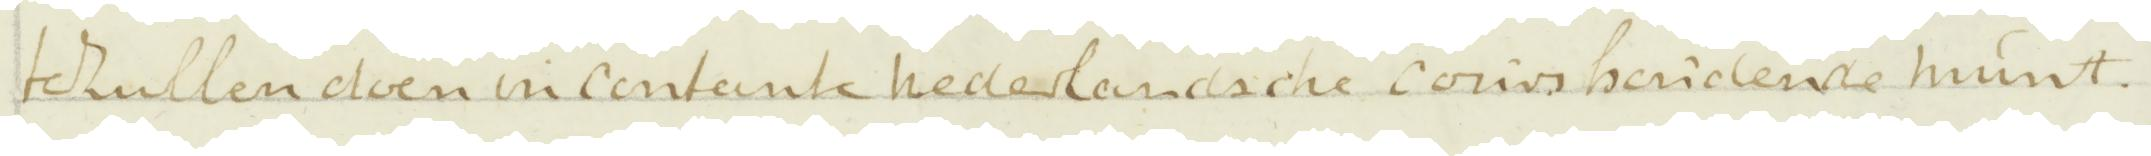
te zullen doen in contante Nederlandsche cours houdende munt-
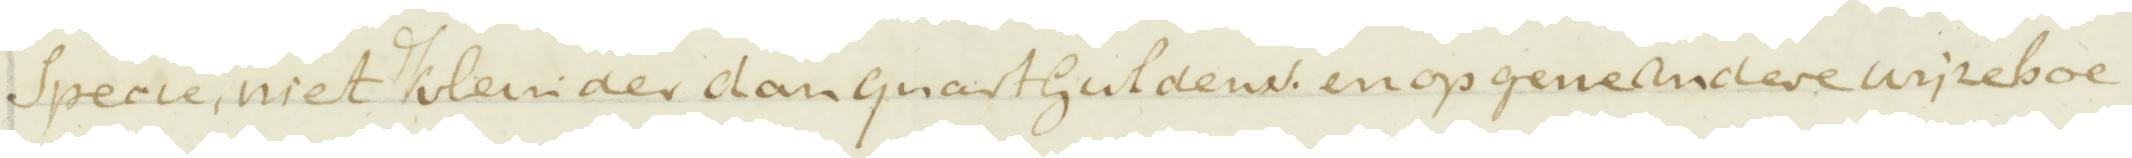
specie, niet kleinder dan quart Guldens en op gene andere wijze hoe
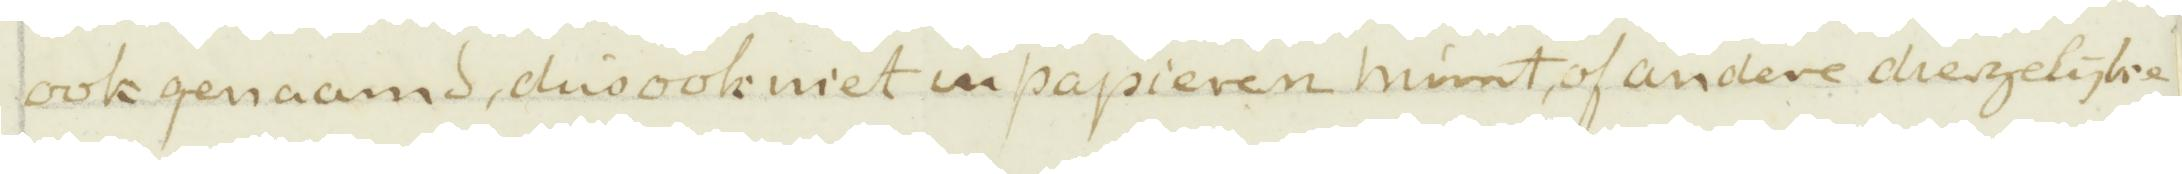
ook genaamd, dus ook niet in papieren munt, of andere diergelijke
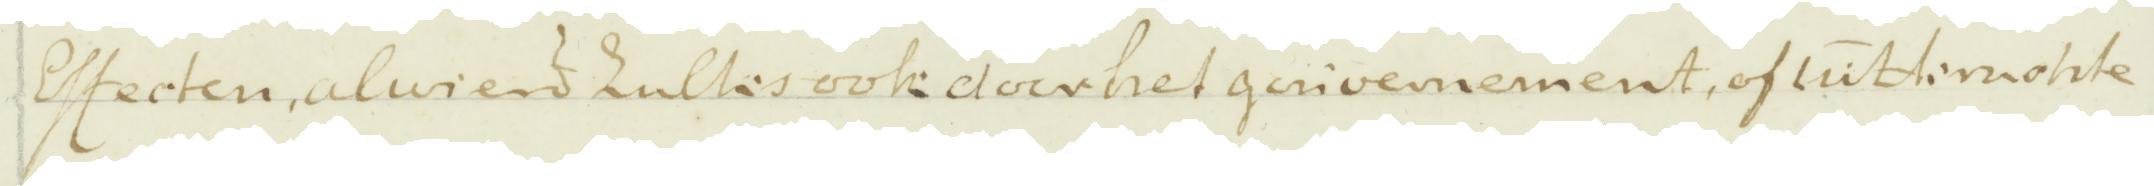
Effecten, al wierd zulks ook door het gouvernement, of uit krachte
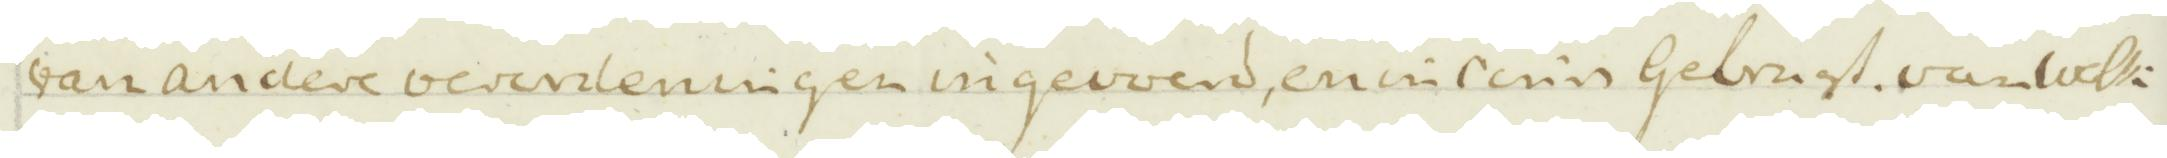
van andere verordeningen ingevoerd, en in cours Gebragt, van welk
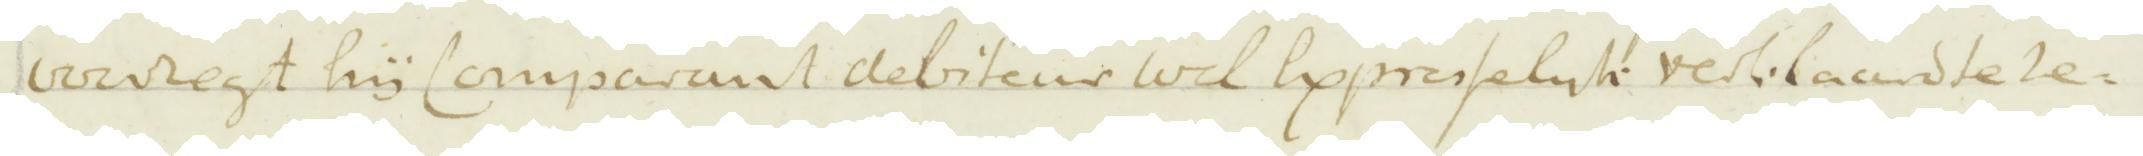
voorregt hij Comparant debiteur wel Expresselyk verklaard te re„
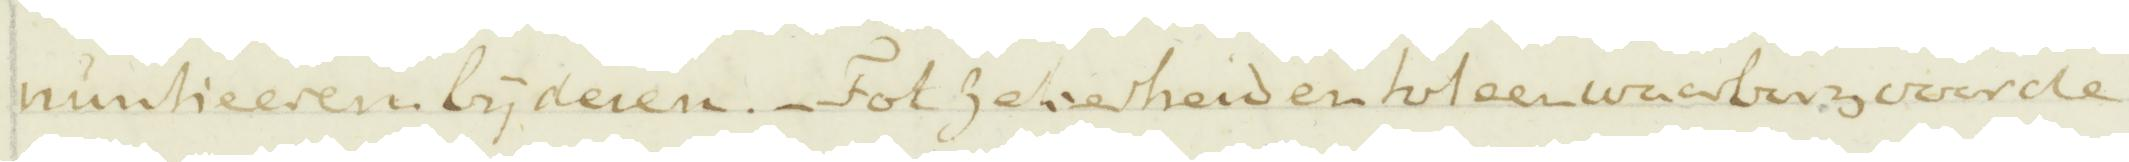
nuntieeren bij desen. — Tot Zekerheid en tot een waarborg voor de
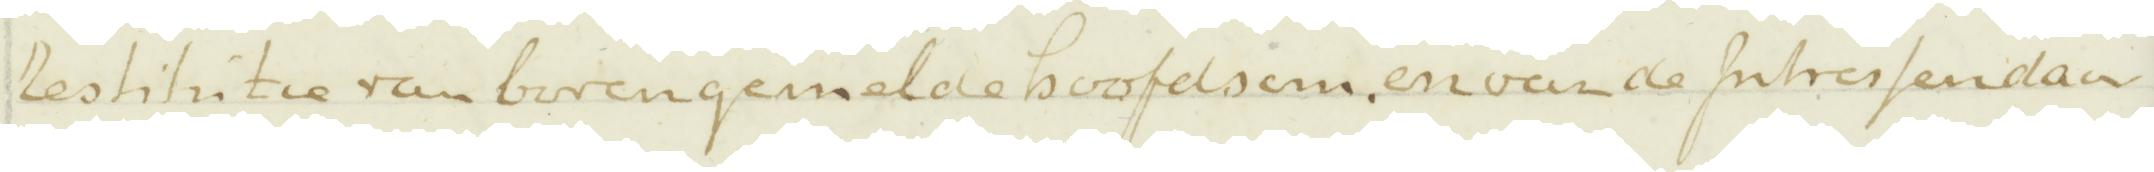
Restitutie van bovengemelde hoofdsom, en van de Jntressen daar
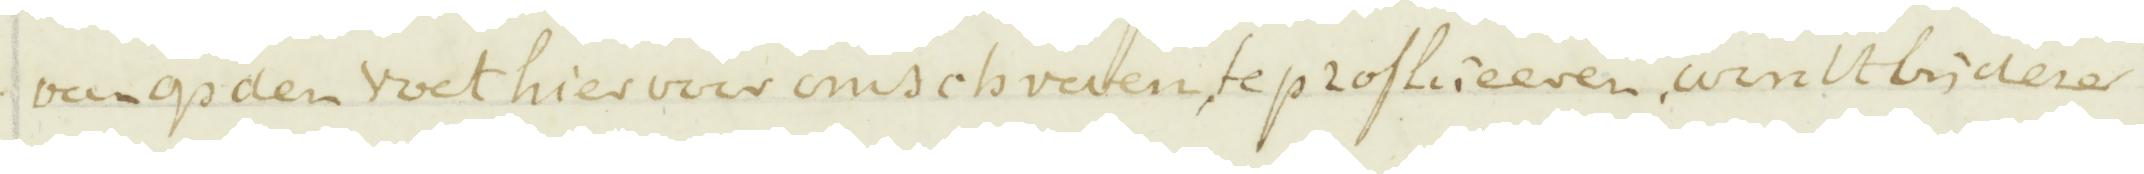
van op den voet hier voor omschreven, te proflueeren, wordt bij dese
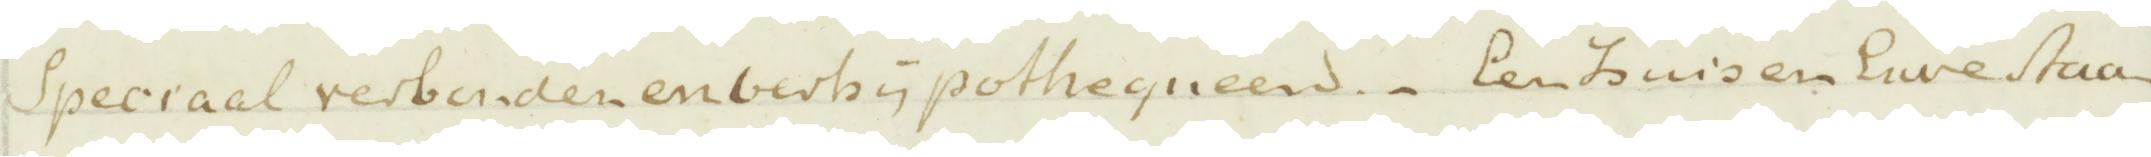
Speciaal verbonden en verhijpothequeerd. — Een huis en Erve staan
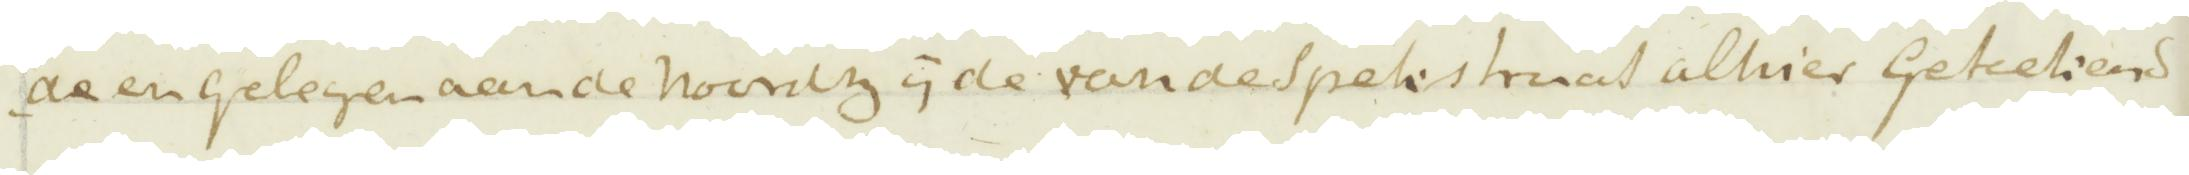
„de en Gelegen aan de Noordzijde van de Spekstraat alhier Geteekend
